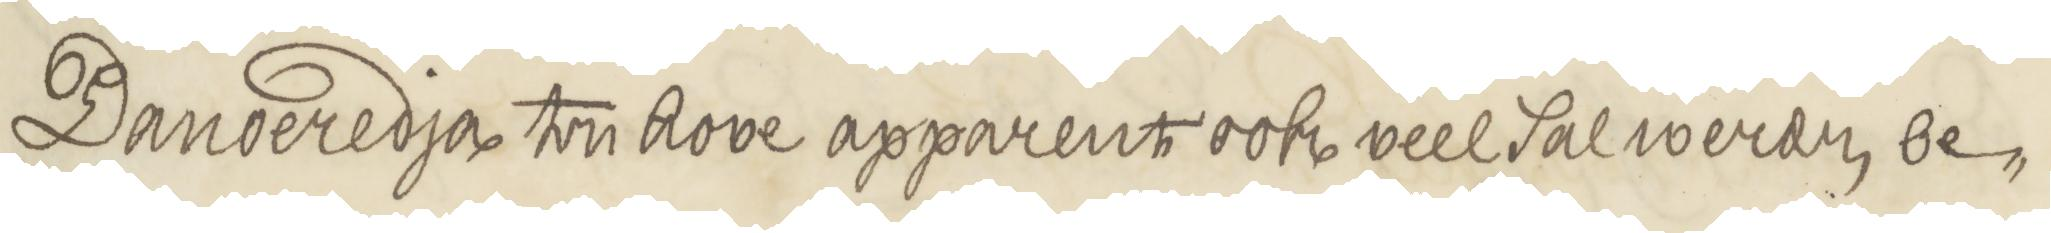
Danoeredja ten hove apparent ook veel sal werden be„
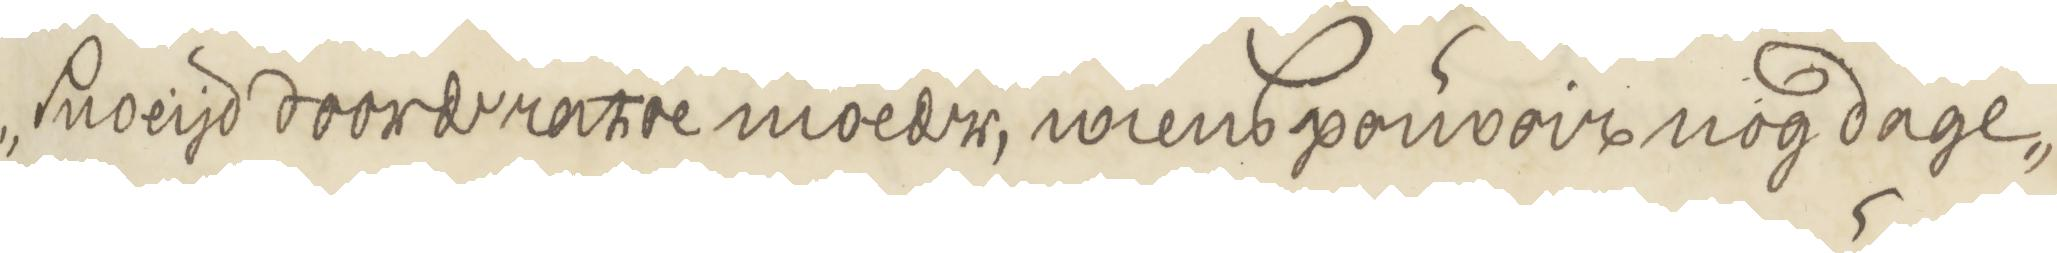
snoeijd door de ratoe moeder, wiens pouvoir nog dage„
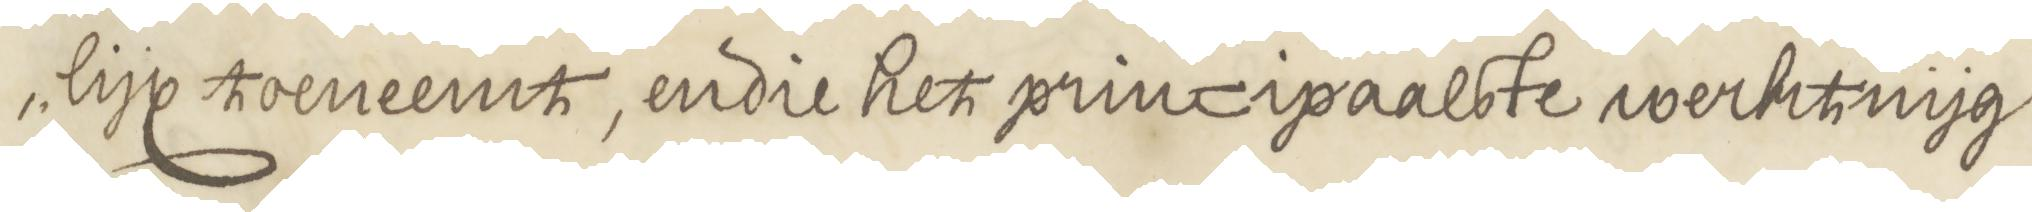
„lijx toeneemt, en die het principaalste werktuijg
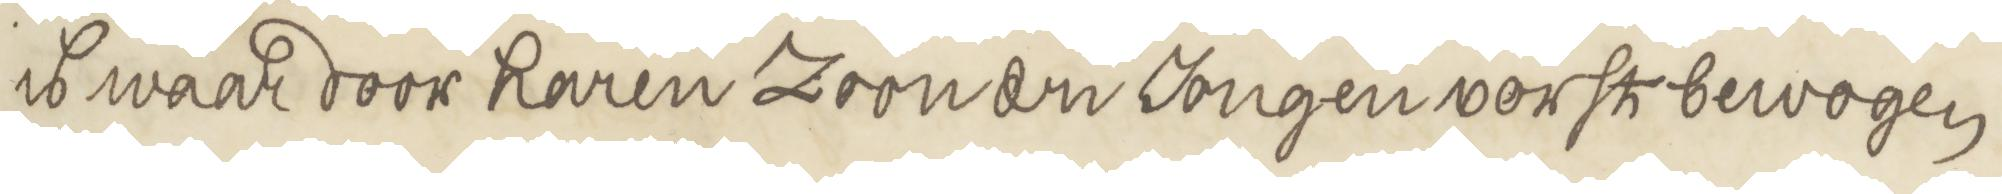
is waar door haren zoon den Jongen vorst bewogen
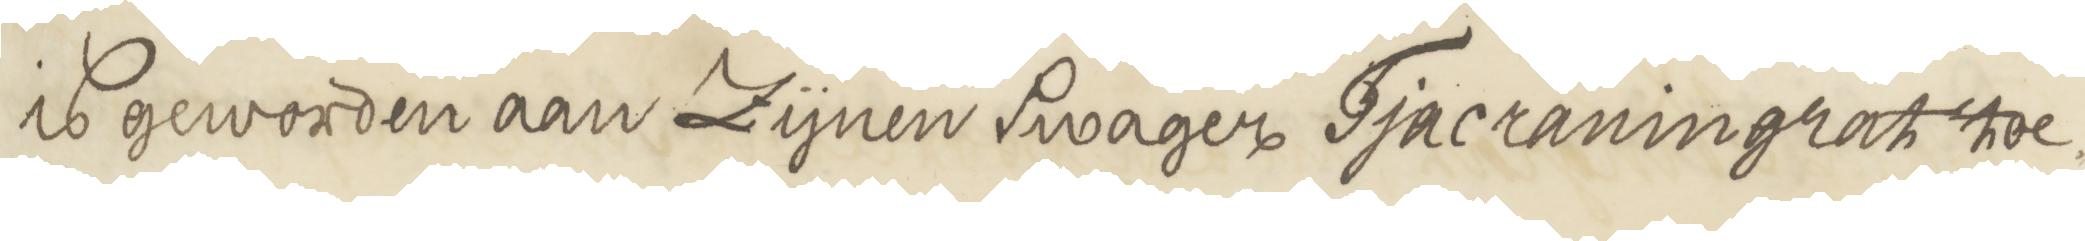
is geworden aan zijnen swager Tjacraningrat toe
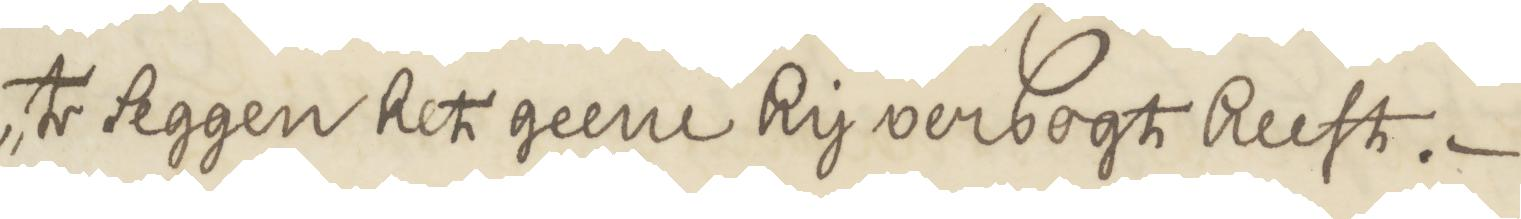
„te seggen het geene hij versogt heeft. —
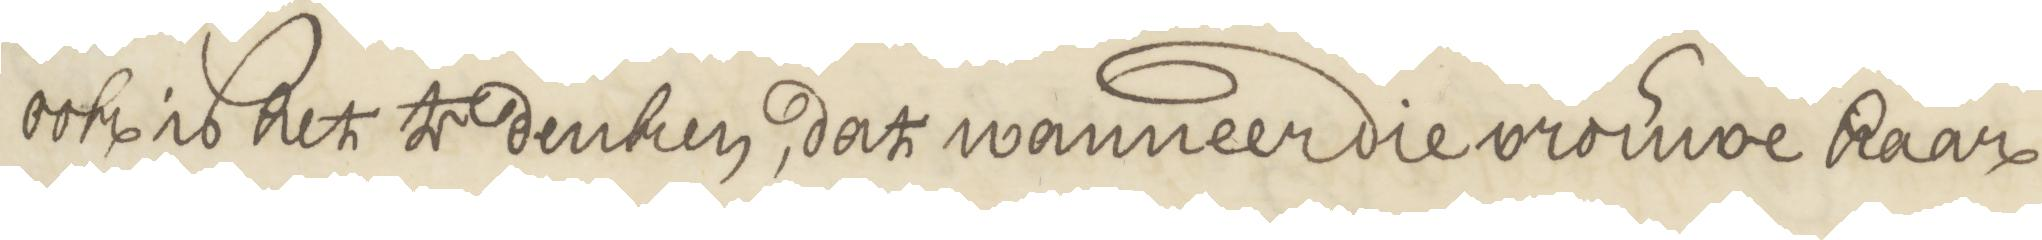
ook is het te denken, dat wanneer die vrouwe haar
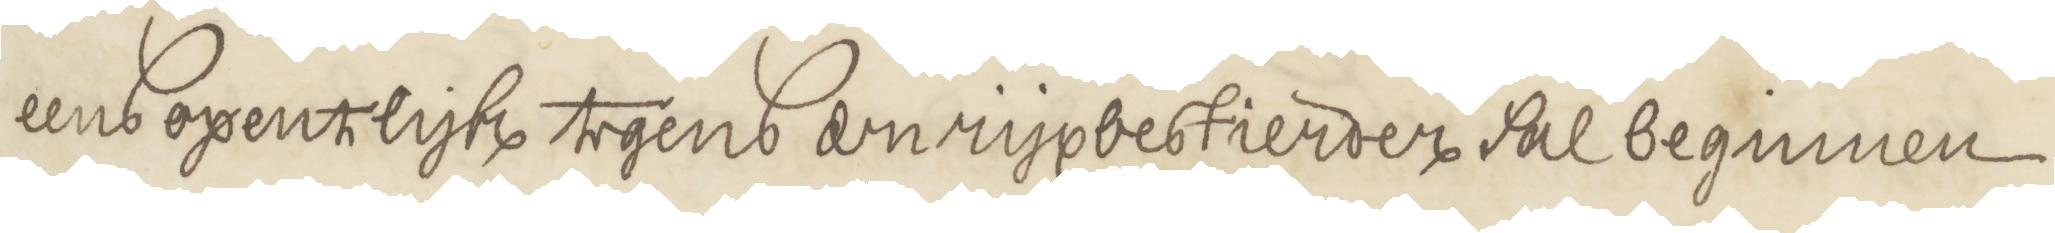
eens opentlijk tegens den rijxbestierder sal beginnen
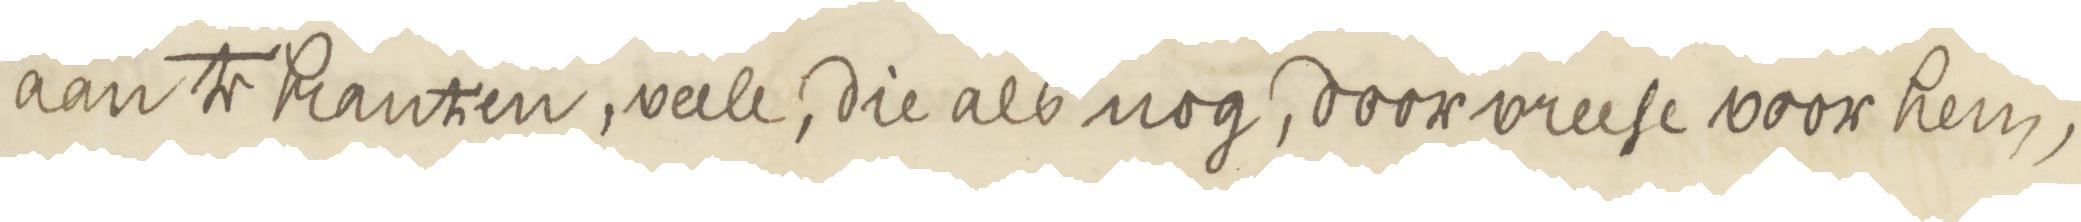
aan te kanten, veele, die als nog, door vreese voor hem,
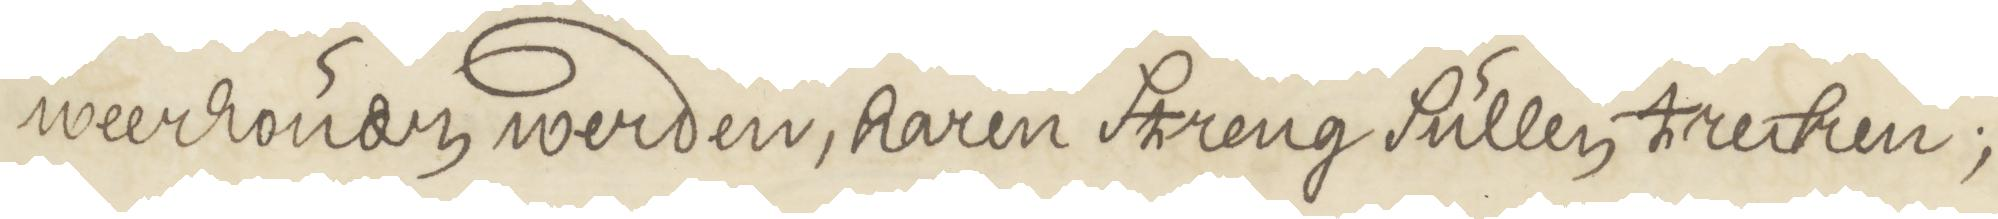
weerhouden werden, haren streng sullen trecken
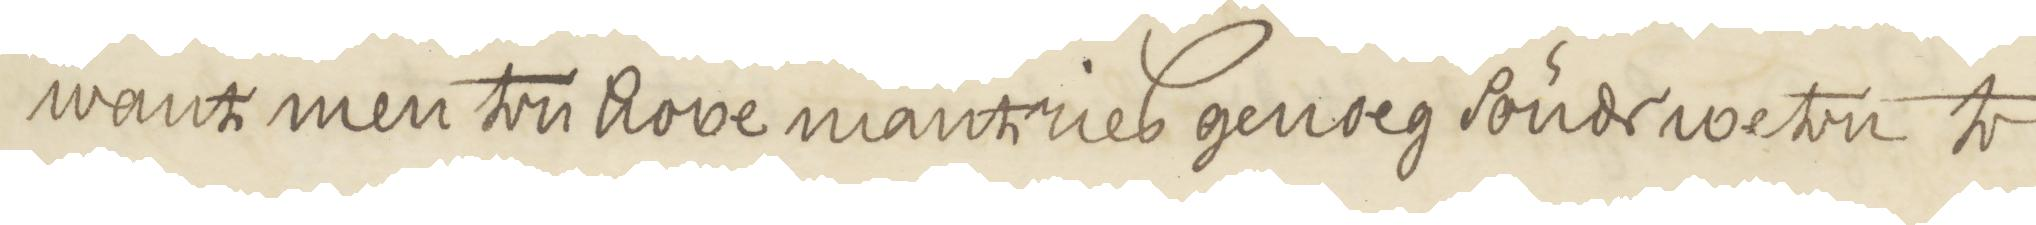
want men ten hove mantries genoeg soude weten te
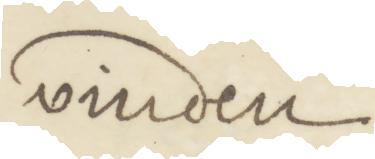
vinden
